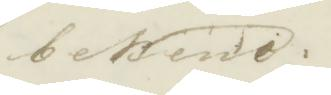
bekend:
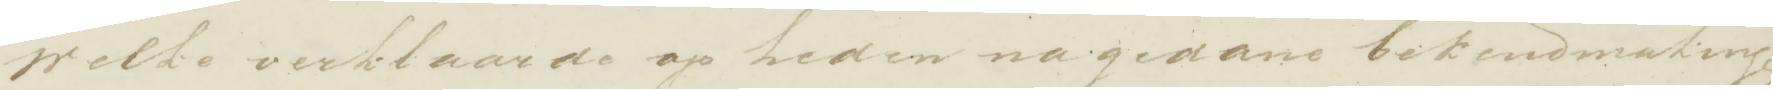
welke verklaarde op heden na gedane bekendmaking
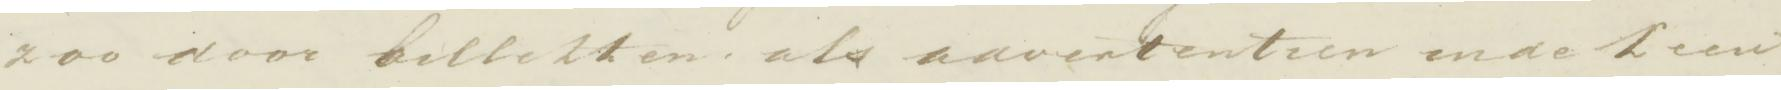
zoo door billetten, als advertentien in de Leeu
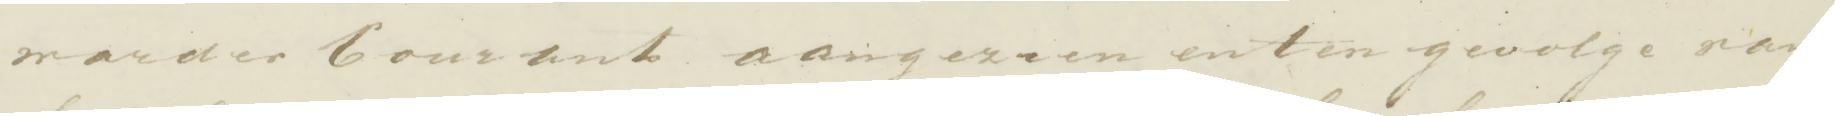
warder Courant aangezien en ten gevolge van
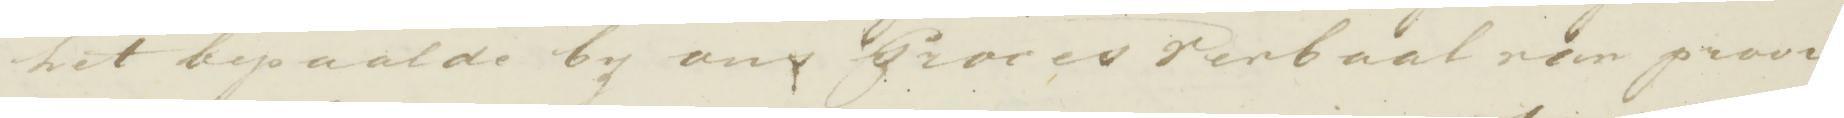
het bepaalde by ons Proces Verbaal van provi
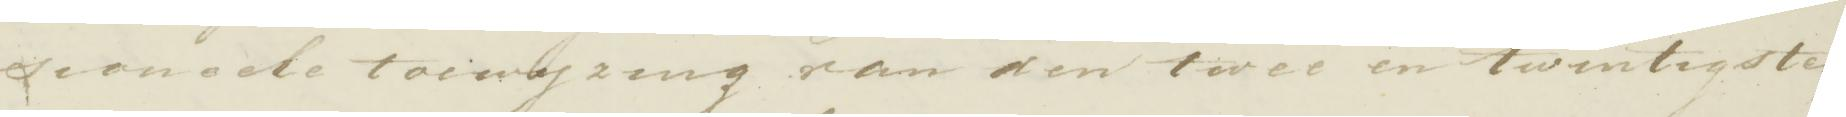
sioneele toewyzing van den twee en twintigsten
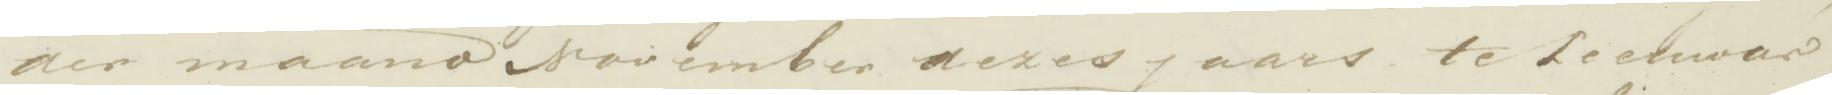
der maand November dezes jaars te Leeuwar
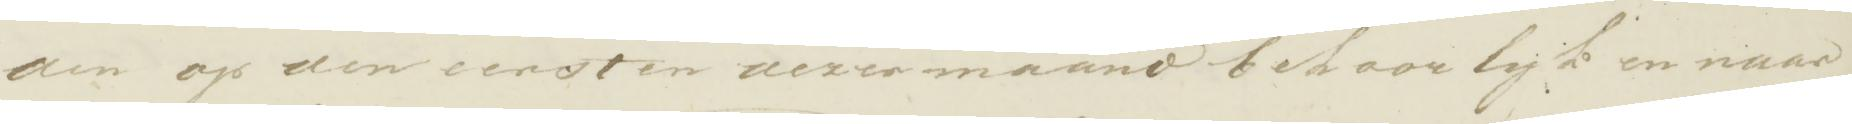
den op den eersten dezer maand behoorlyk en naar
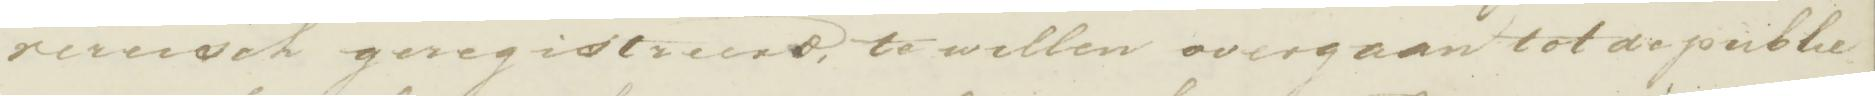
vereisch geregistreerd, te willen overgaan tot de publie
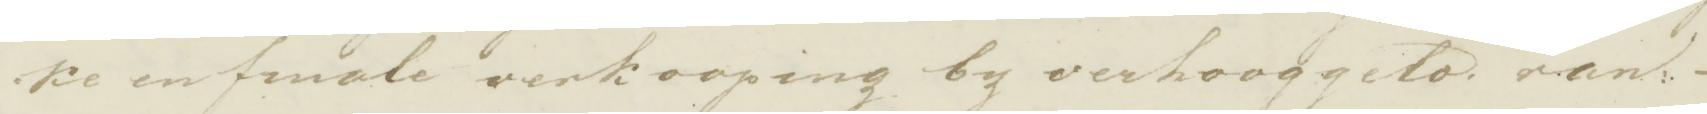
ke en finale verkooping bij verhooggeld. van:
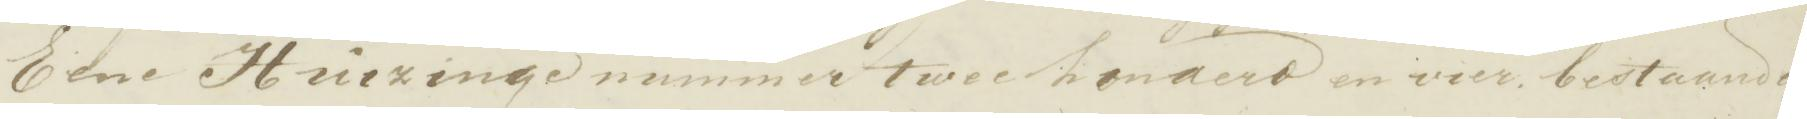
Eene Huizinge nummer twee honderd en vier, bestaande
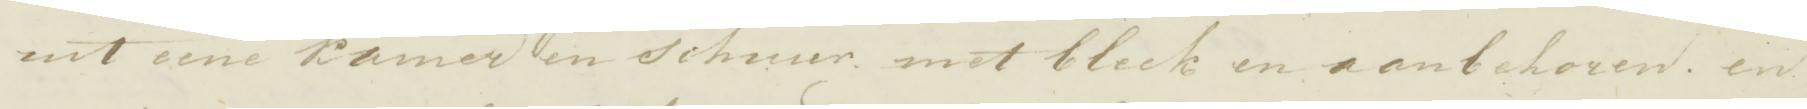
uit eene kamer en schuur, met bleek en aanbehoren. en
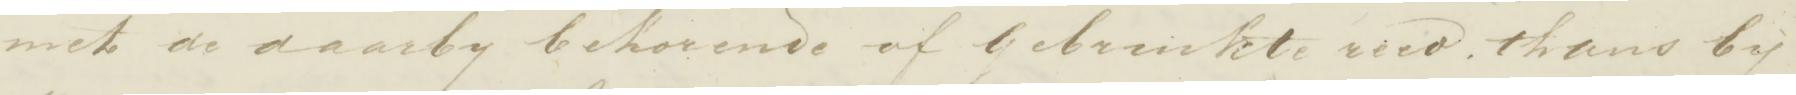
met de daarby behorende of gebruikte reed, thans by
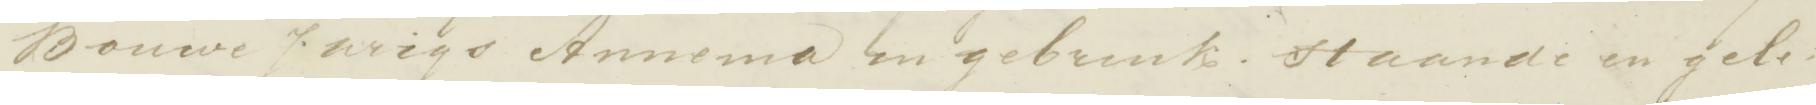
Bouwe Jarigs Annema in gebruik. staande en gele
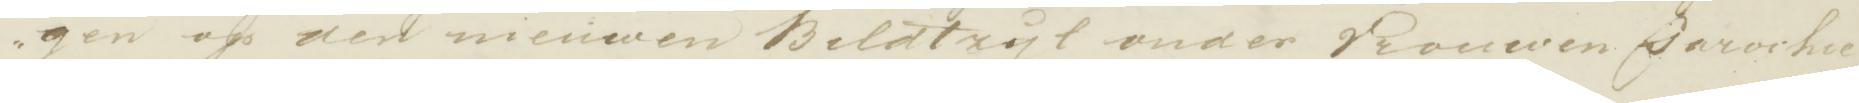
„gen op den nieuwen Bildtzyl onder Vrouwen Parochie
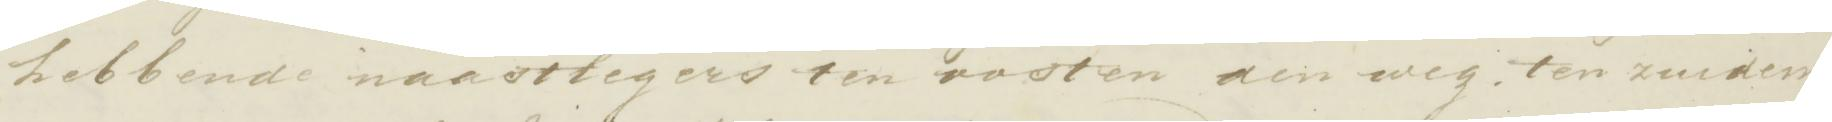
hebbende naastlegers ten oosten den weg, ten zuiden
